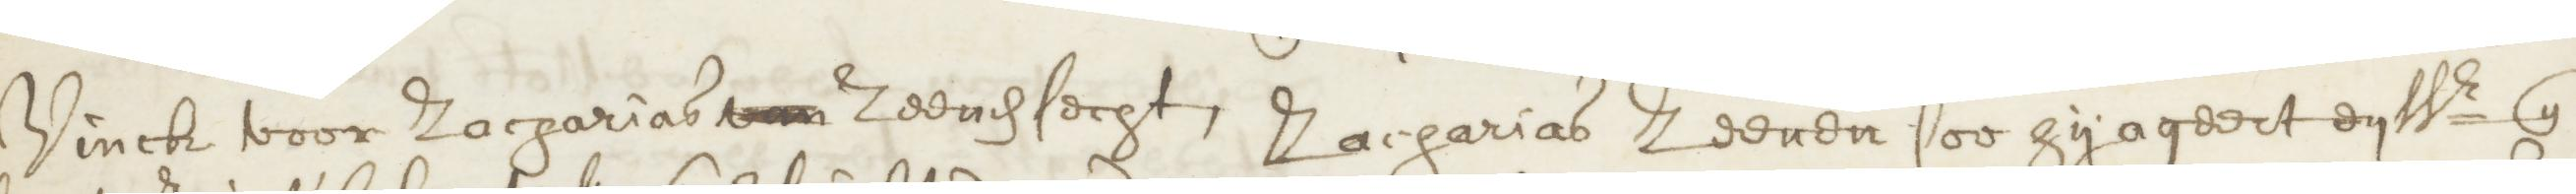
Vinck voor zacharias van zeenen secht, Zacharias Zeenen soo hij ageert eyss=r ende
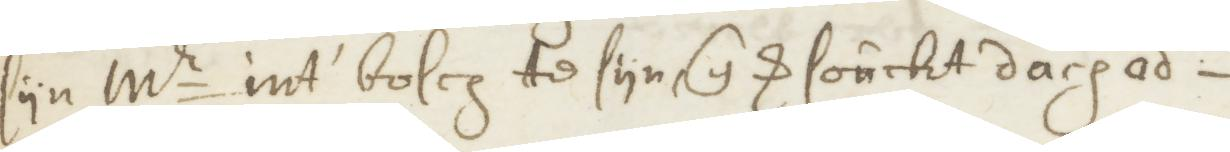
sijn M=r in't bosch te sijn ende versonckt dach ad -
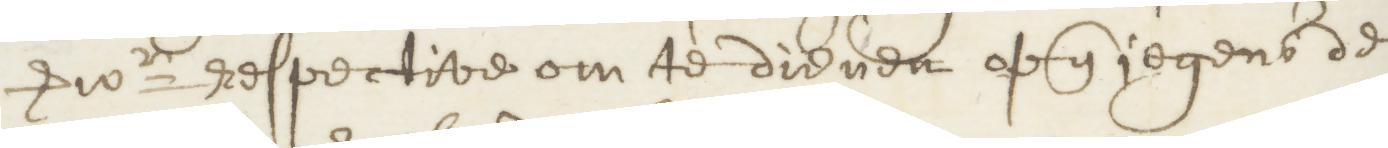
verw=r respective om te dienen op ende jegens de
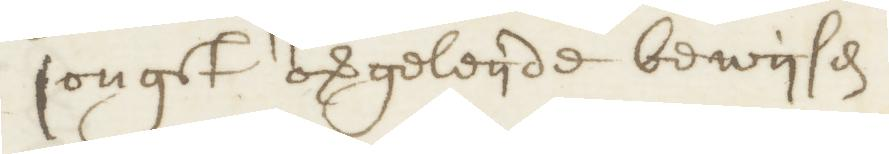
jongst overgeleyde bewijsen
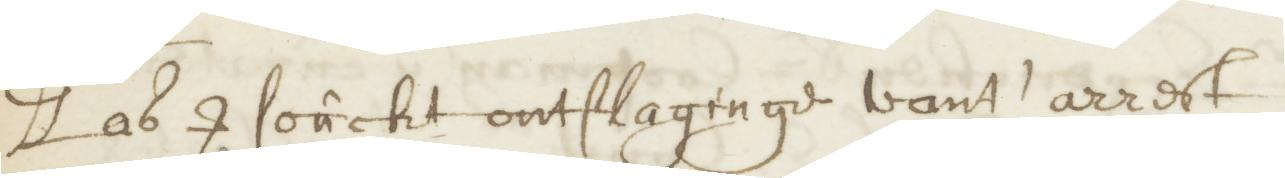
Zas verouckt ontslaginge vant' arrest
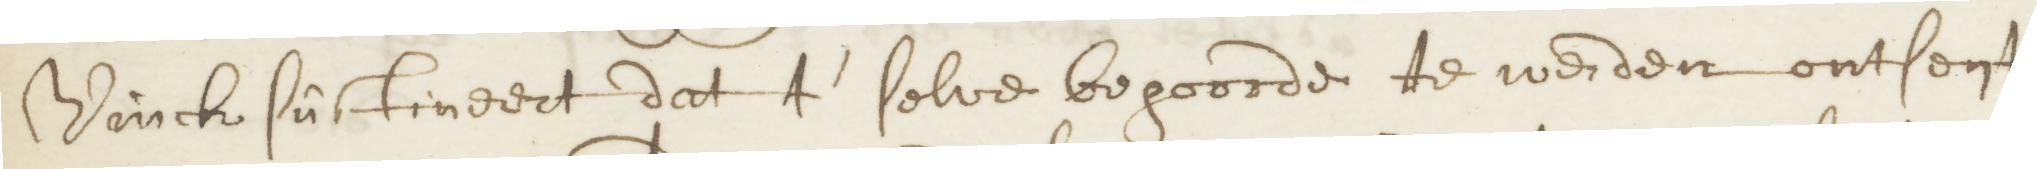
Vinck sustineert dat t' selve behoorde te werden ontseyt
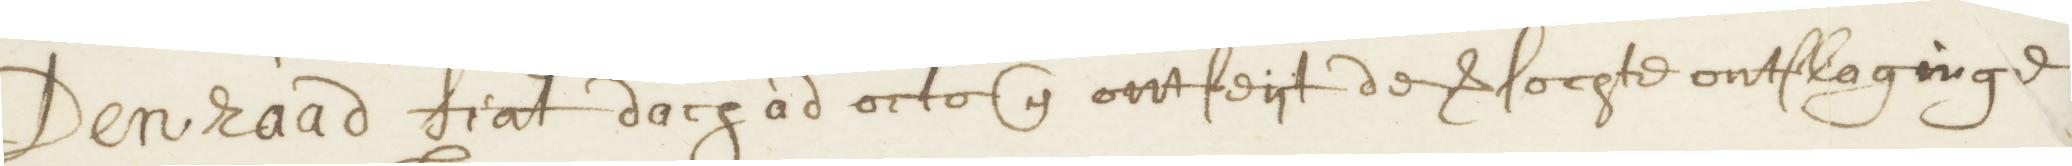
Den raad fiat dach ad octo ende ontseijt de versochte ontslaginge
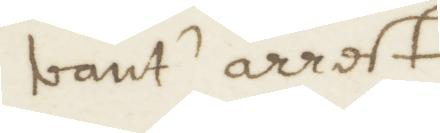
vant' arrest
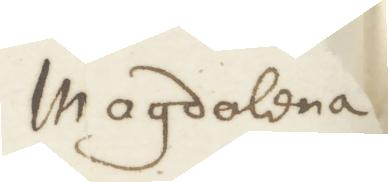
Magdalena
